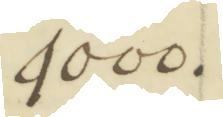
4000.
